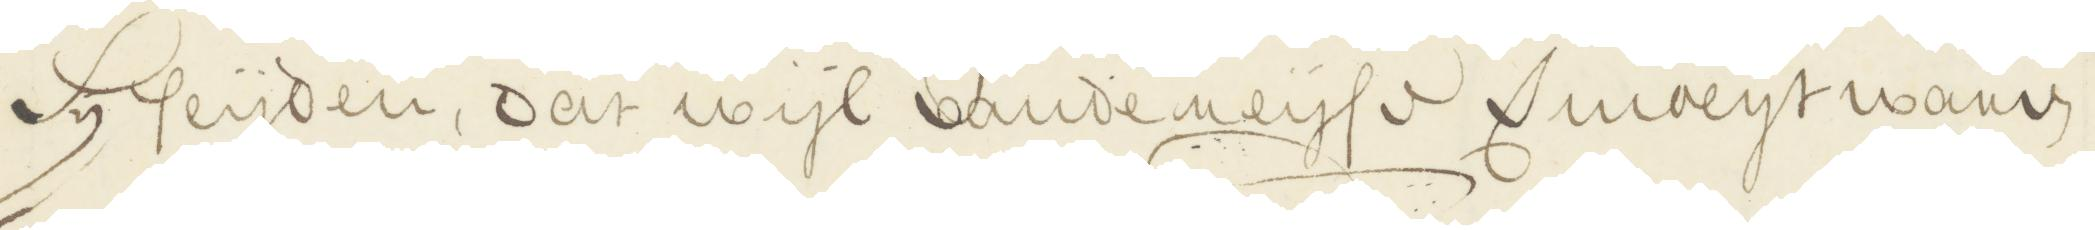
sij seijden, dat wijl vande reijse vermoeijt waren
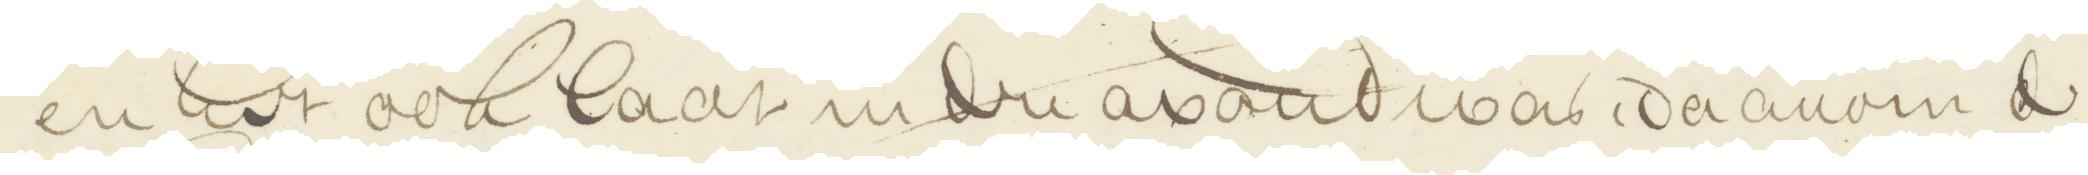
en het ook laat in den avond was, daarom de
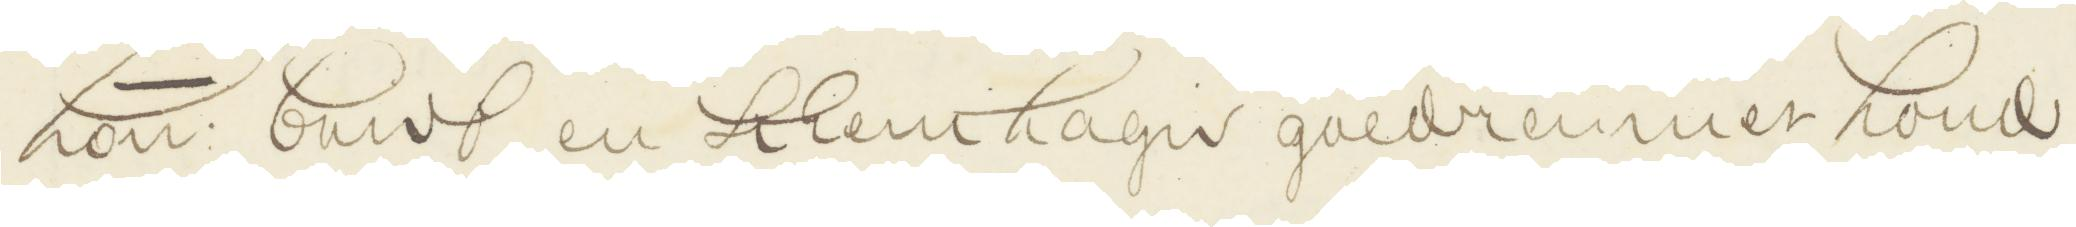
kon: brief en schenckagie goederen niet konde
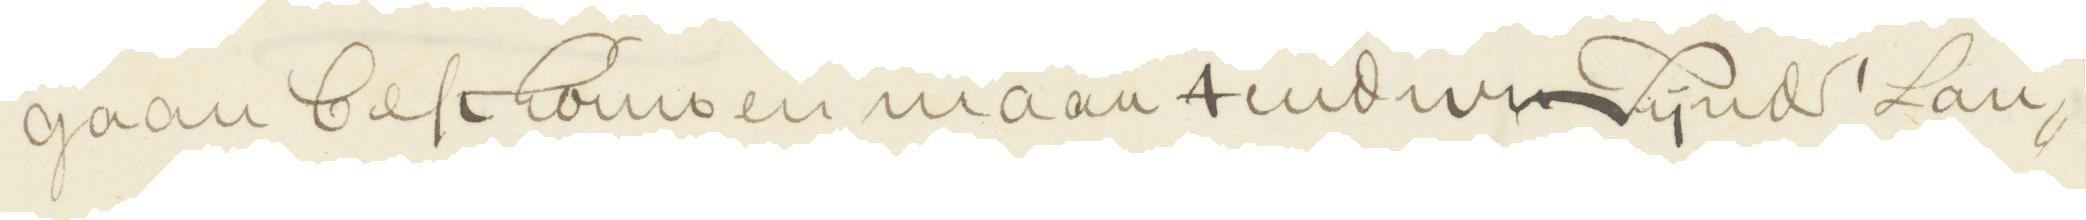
gaan beschouwen maar t indier Eijnde 'san„
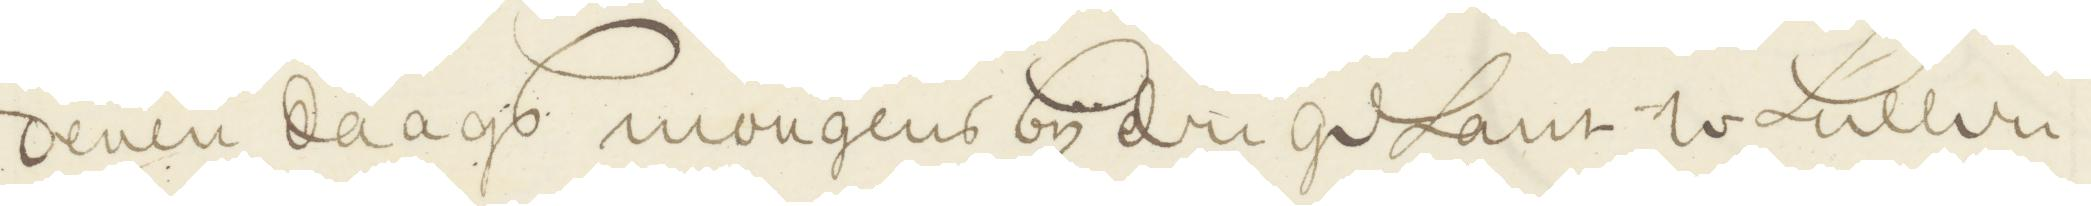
deren daags morgens bij den gesant te sullen
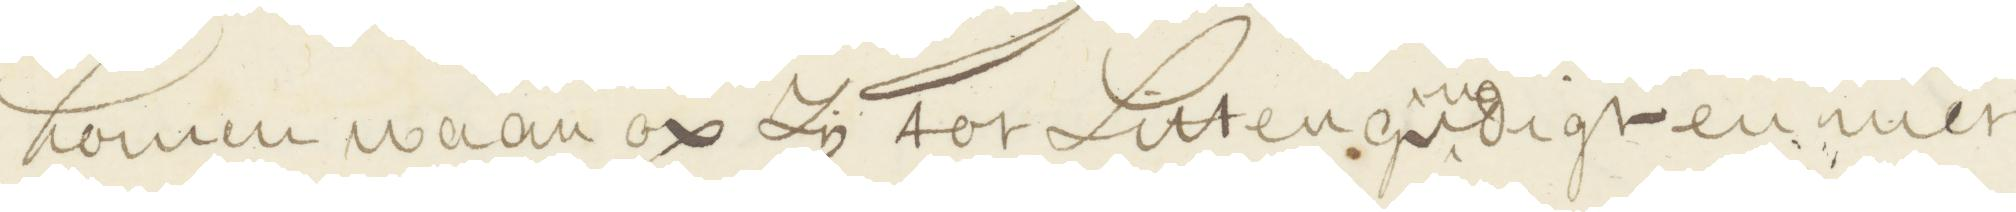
komen waar op zij tot sitten ge^^ndigt en met
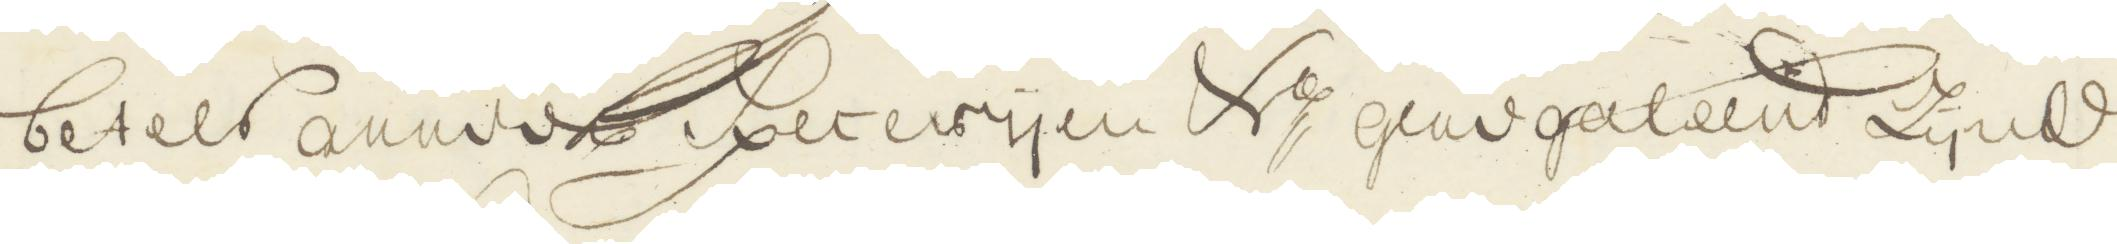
betels arreek specerijen &„a geregaleert zijnde
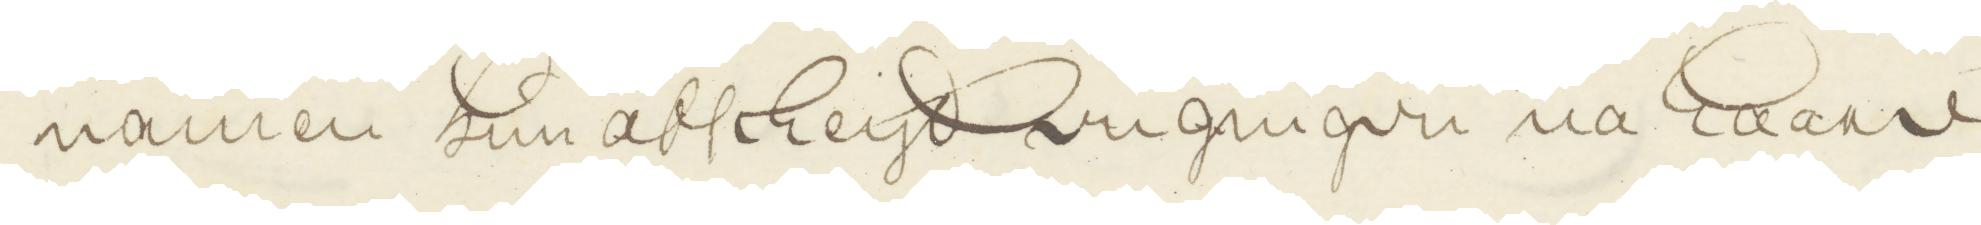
namen hun afscheijd en gingen na haare
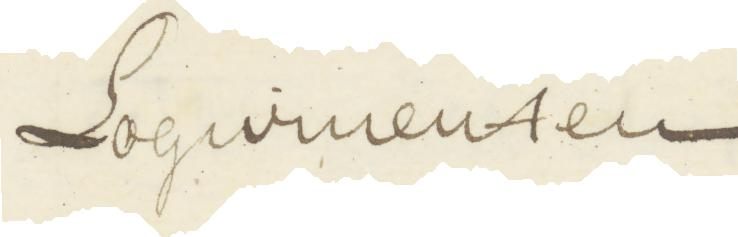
Logiementen
